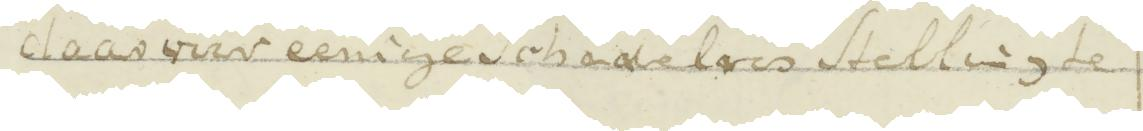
daar voor eenige schadeloos stelling te
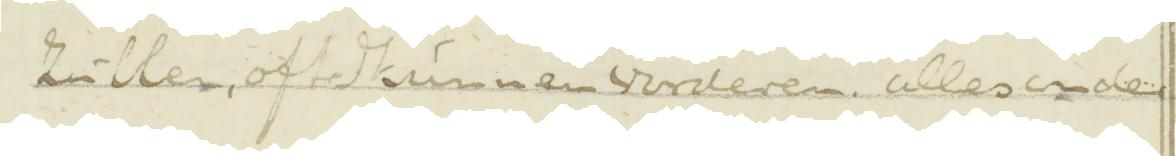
Zullen, ofte kunnen vorderen. alles onder
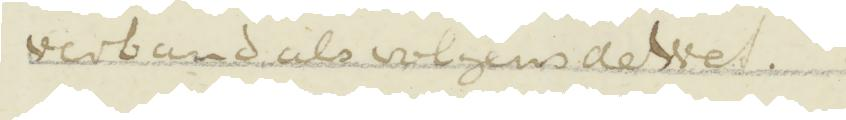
verband als volgens de Wet.
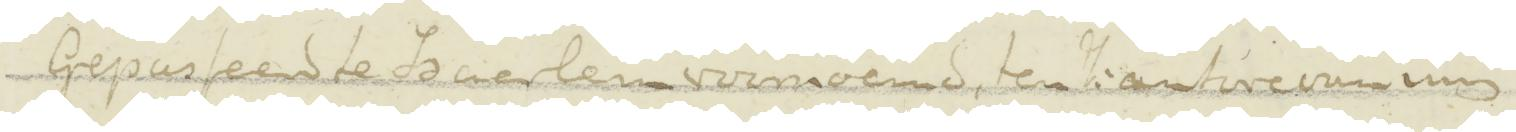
Gepasseerd te haarlem voornoemd, ten kantore van mij
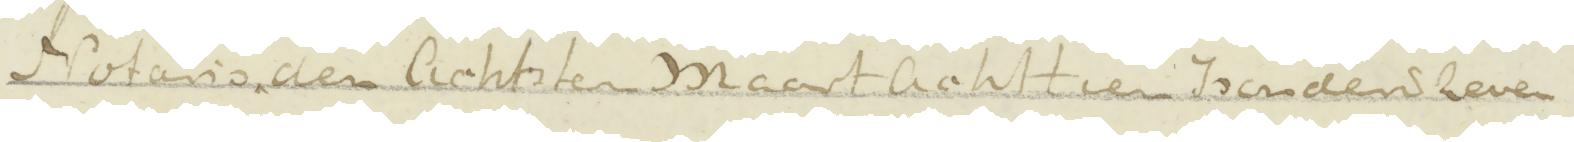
Notaris, den Achtsten Maart Achttien honderd zeven
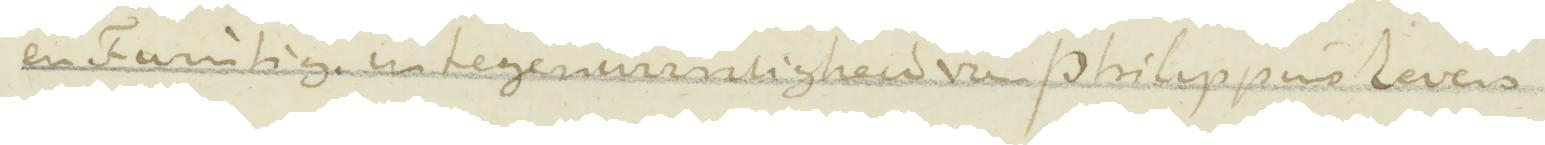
en Twintig, in tegenwoordigheid van Philippus Revers
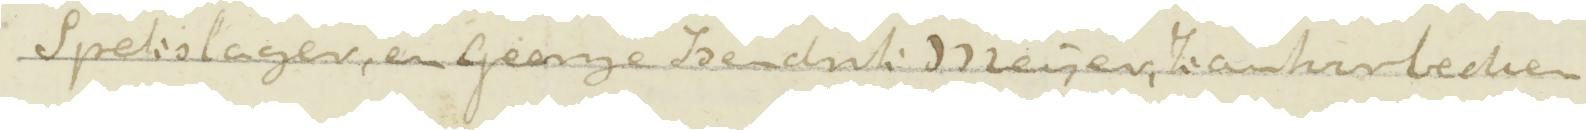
spekslager, en George Hendrik Meijer, kantoorbedien
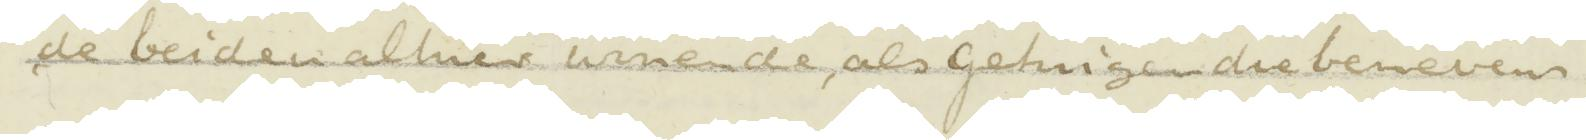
de beiden alhier wonende, als getuigen die benevens
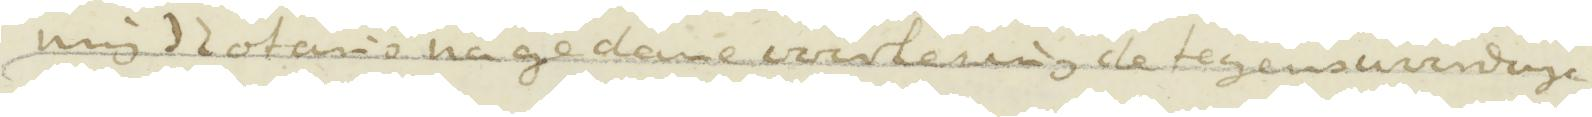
mij Notaris na gedane voorlezing de tegenswoordige
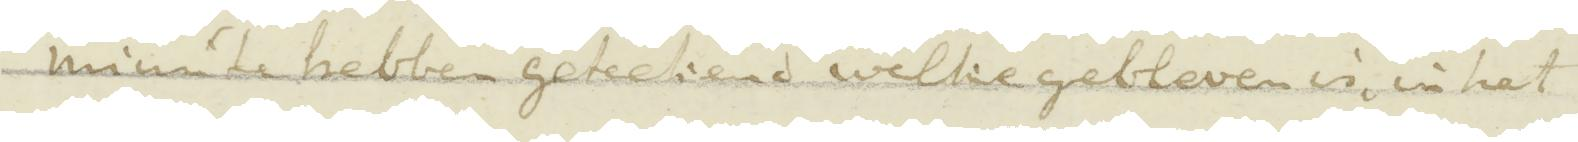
minute hebben geteekend welke gebleven is in het
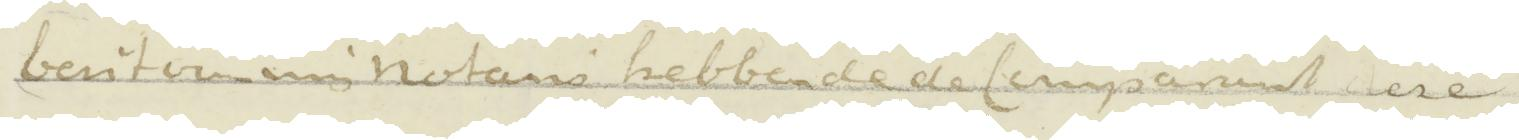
bezit van mij Notaris hebbende de Comparant deze
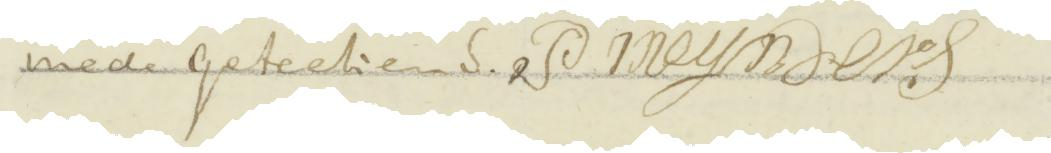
mede geteekend. P Meynders
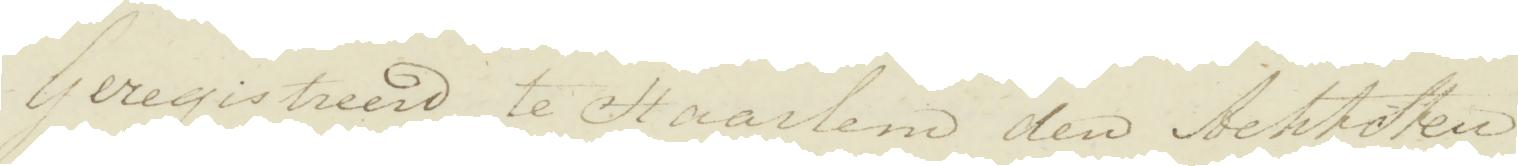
Geregistreerd te Haarlem den Achtsten
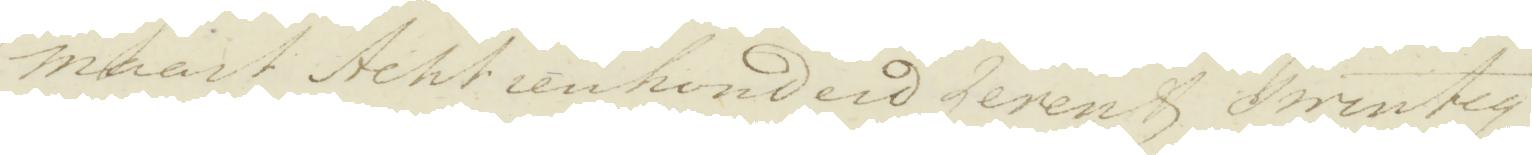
maart Achtienhonderd Zeven & Twintig
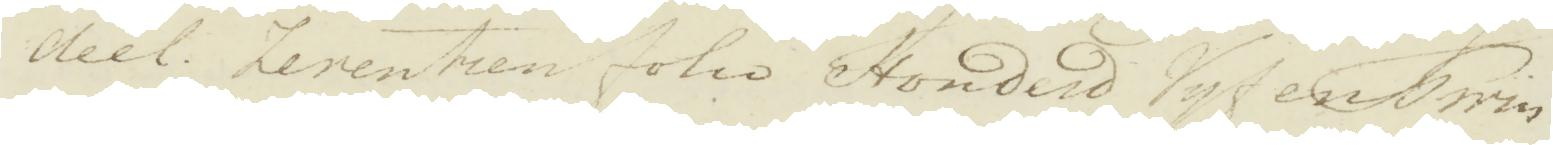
deel. Zeventien folio Honderd Vyf en Twin
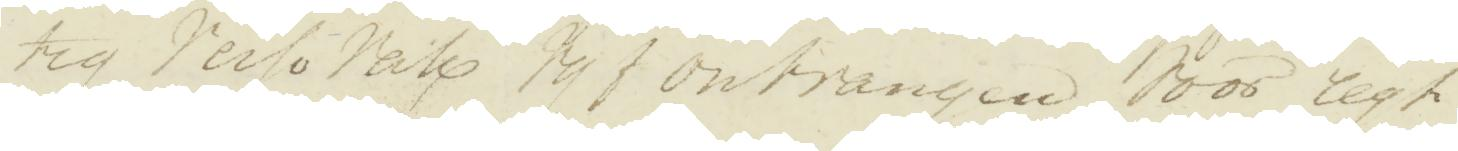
tig Verso Vak Vyf ontvangen Voor regt
